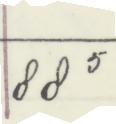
885
